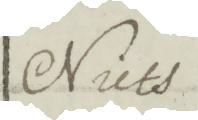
Niets
